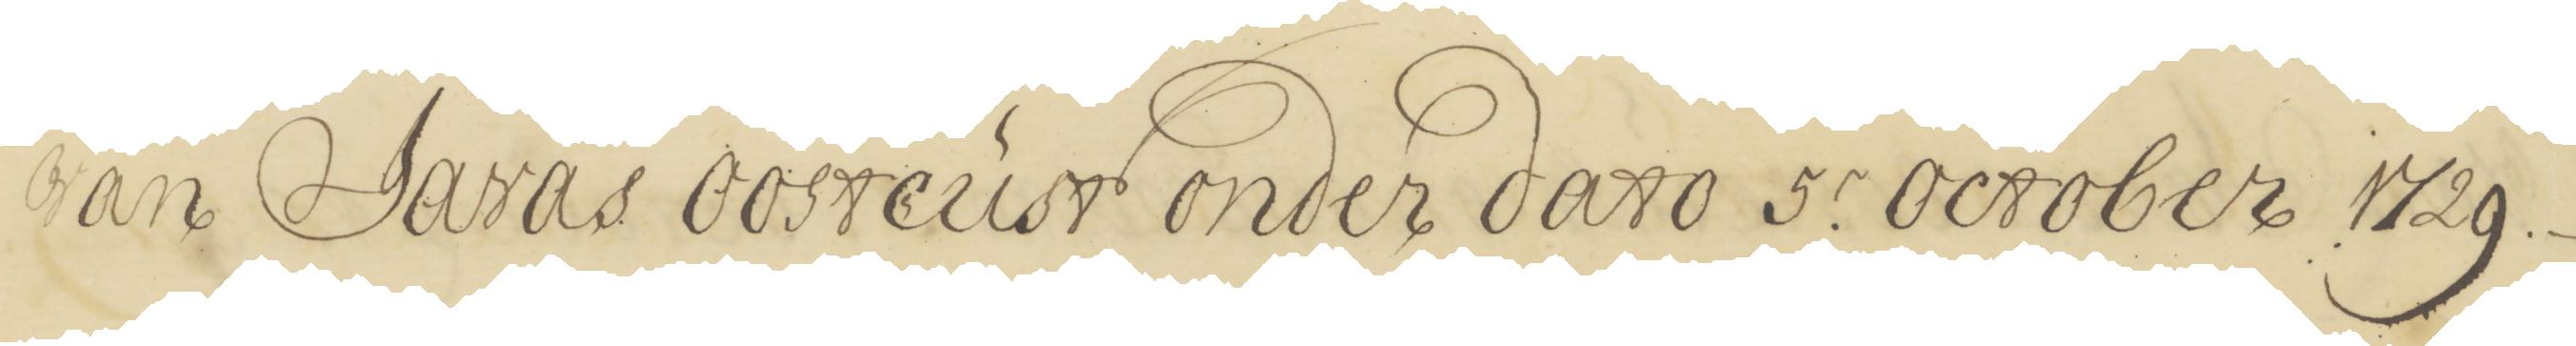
Van Javâs oostcust onder dato 5.' october 1729.
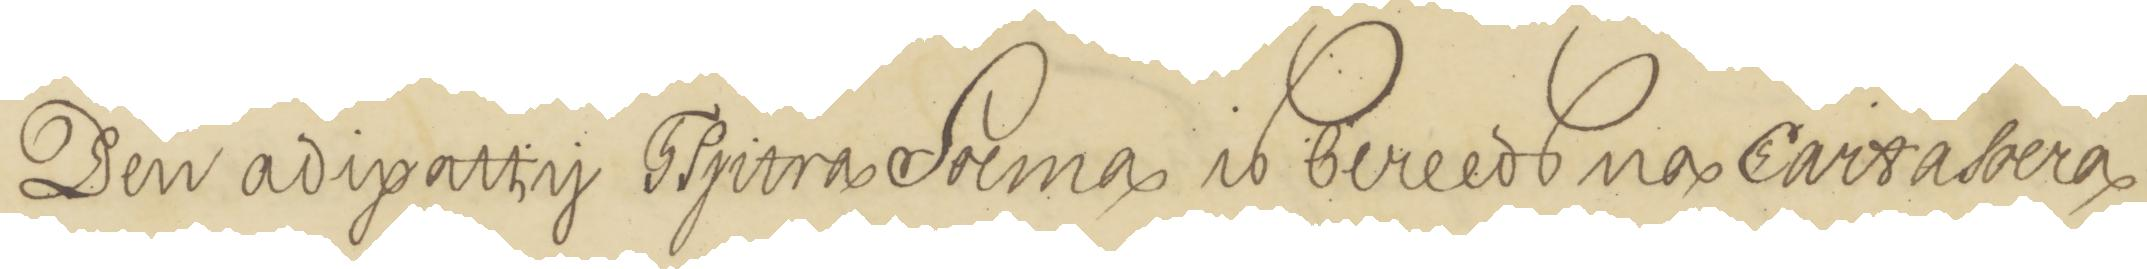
Den adipattij Tsjitra Soema is bereeds na Cartasoera
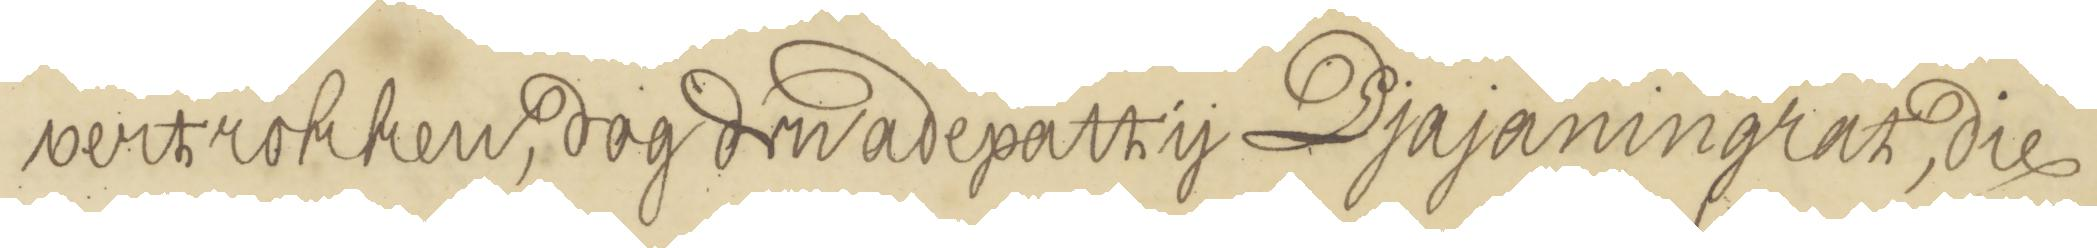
vertrokken, dog den adepattij Djajaningrat, die
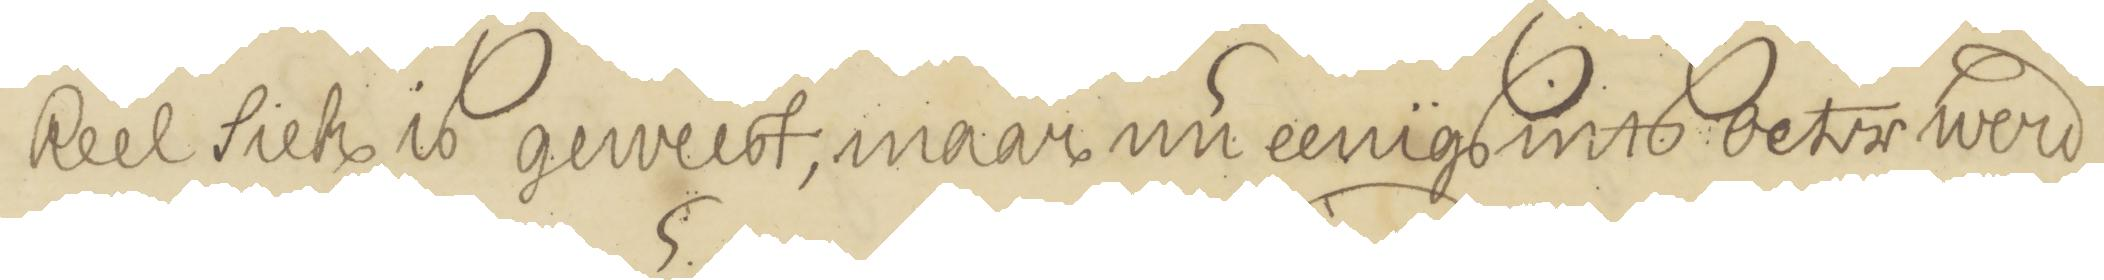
heel siek is geweest, maar nu eenigsints beter werd,
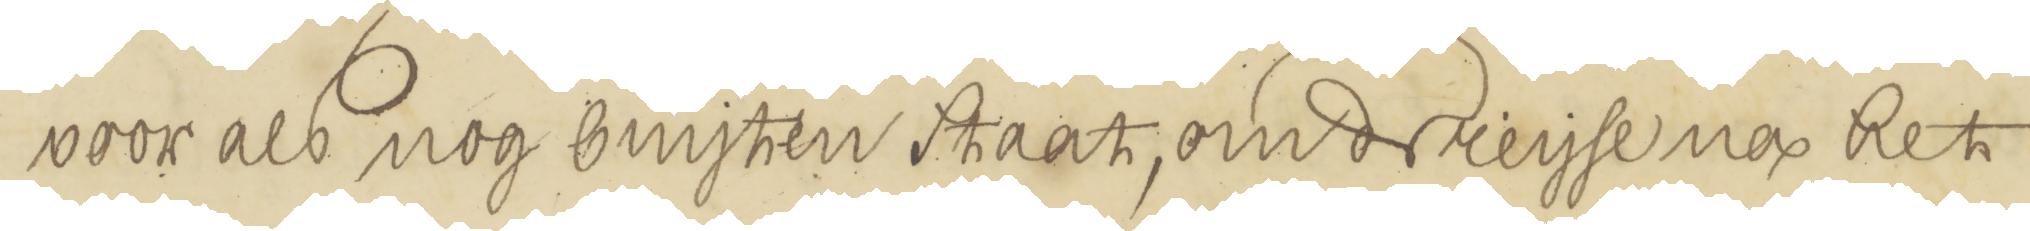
voor als nog buijten staat, om de reijse na het
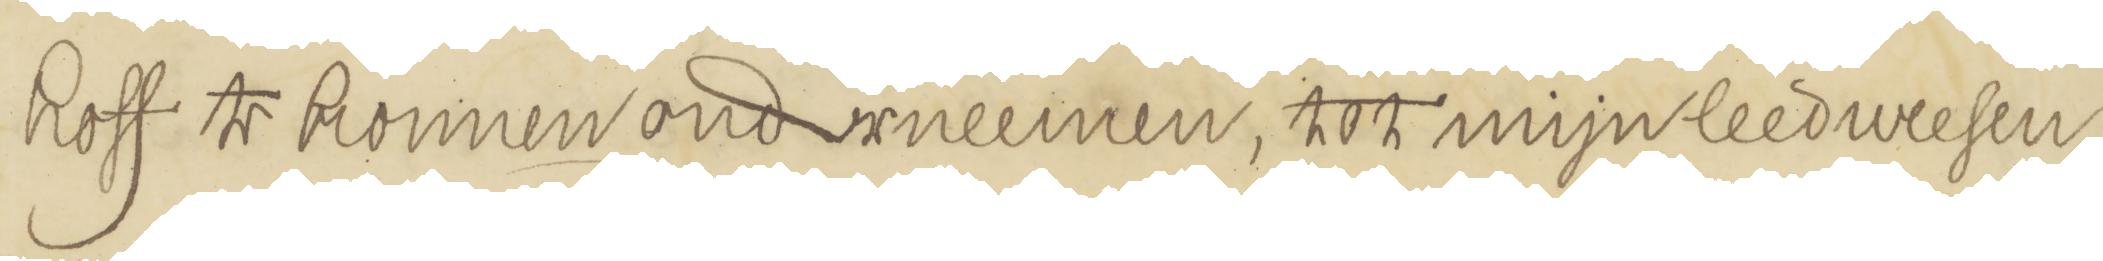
hoff te konnen onderneemen, tot mijn leedweesen,
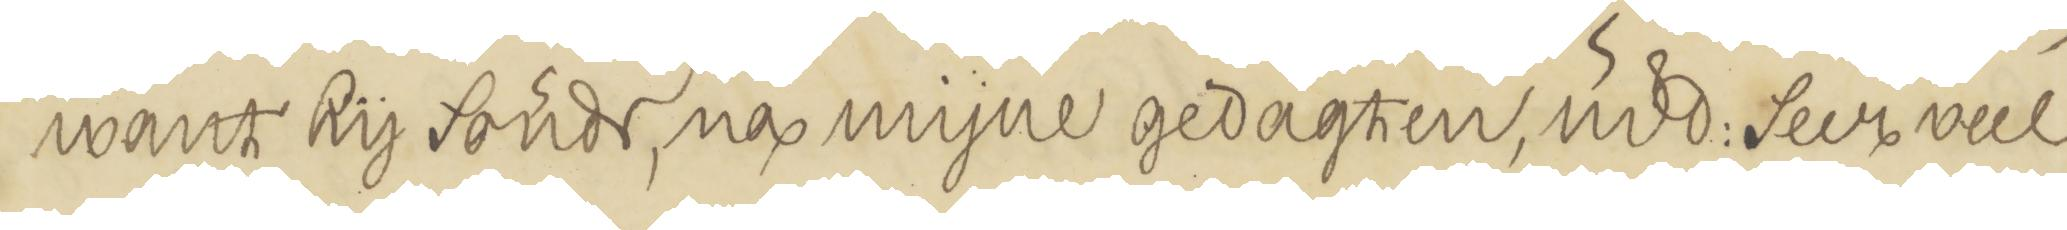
want hij soude, na mijne gedagten, uEd: seer veel
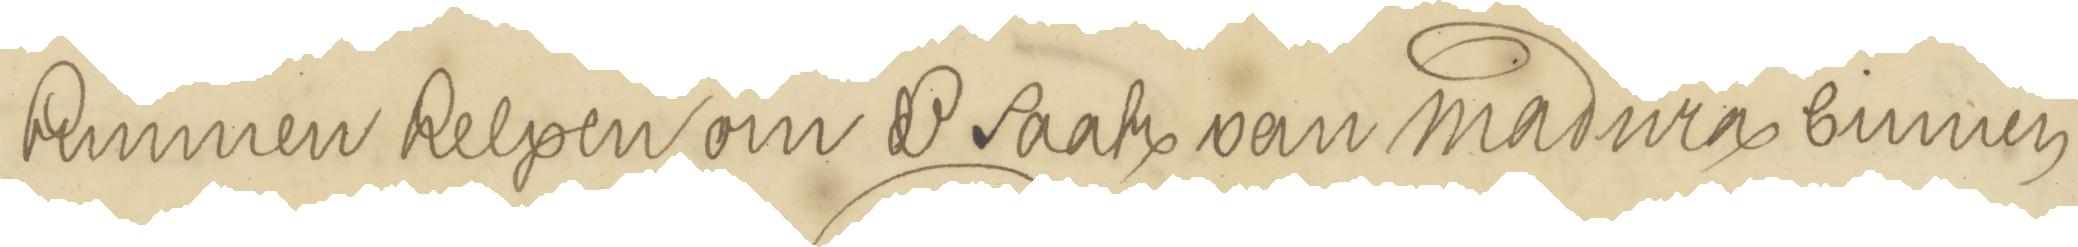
kunnen helpen, om de saak van madura binnen
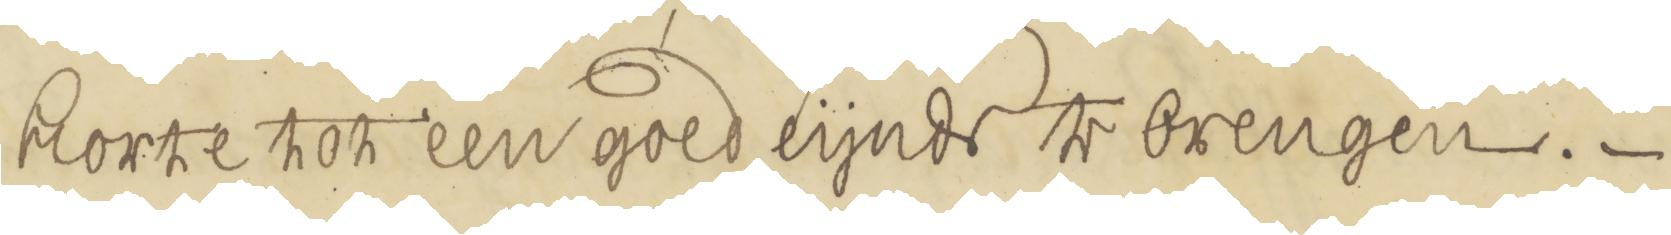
korte tot een goed eijnde te brengen. —
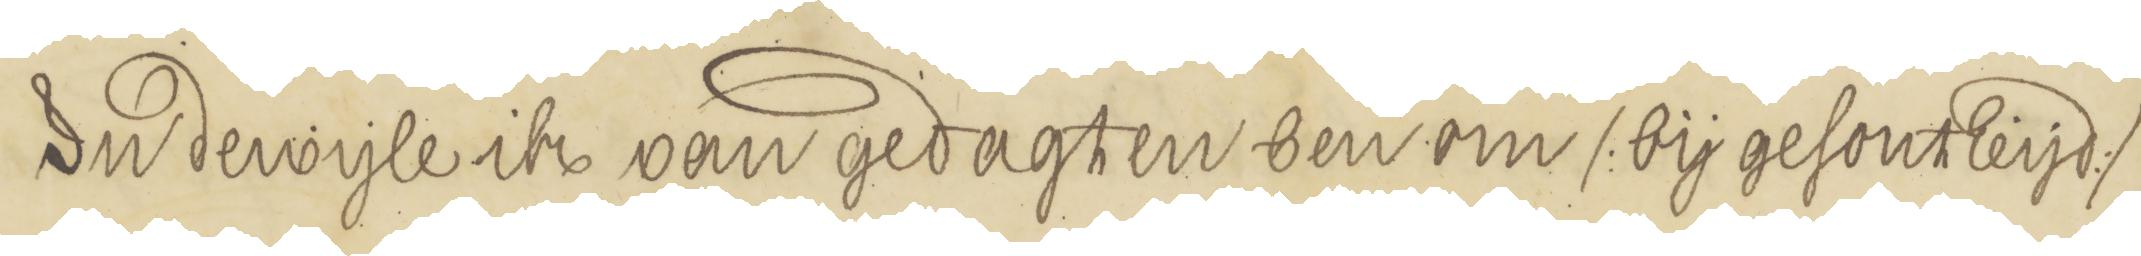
En dewijle ik van gedagten ben om /:bij gesontheijd:/
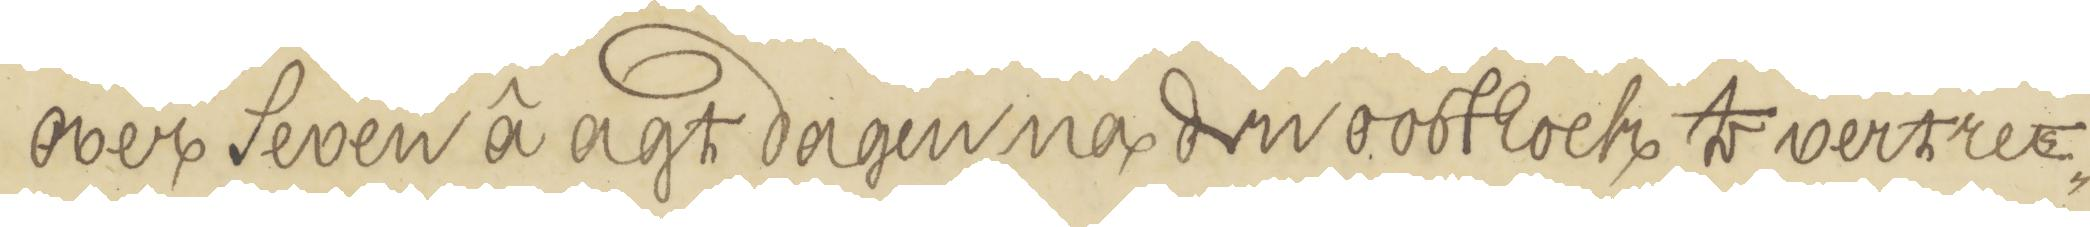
over seven â agt dagen na den oosthoek te vertrec„
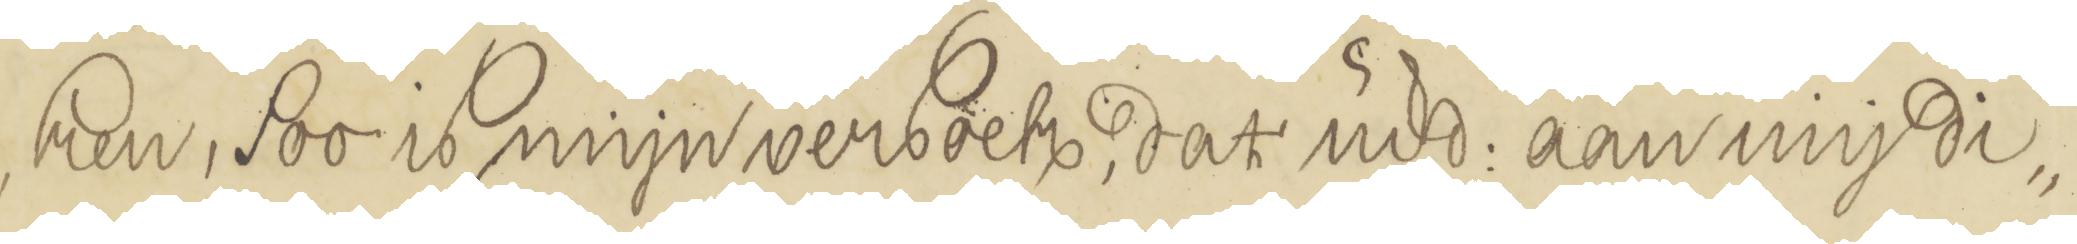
„ken, soo is mijn versoek, dat uEd: aan mij di„
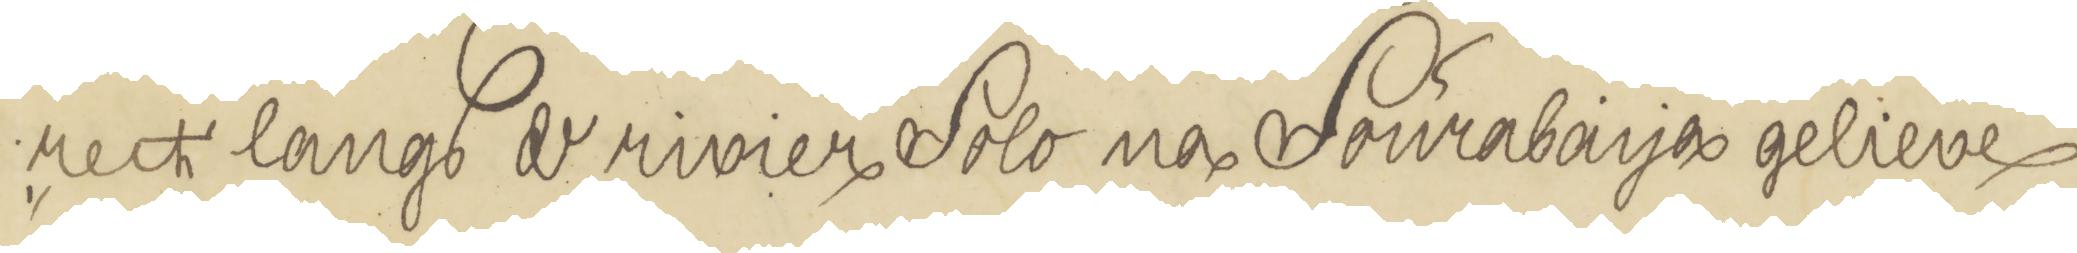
„rect langs de rivier Solo na Sourabaija gelieve
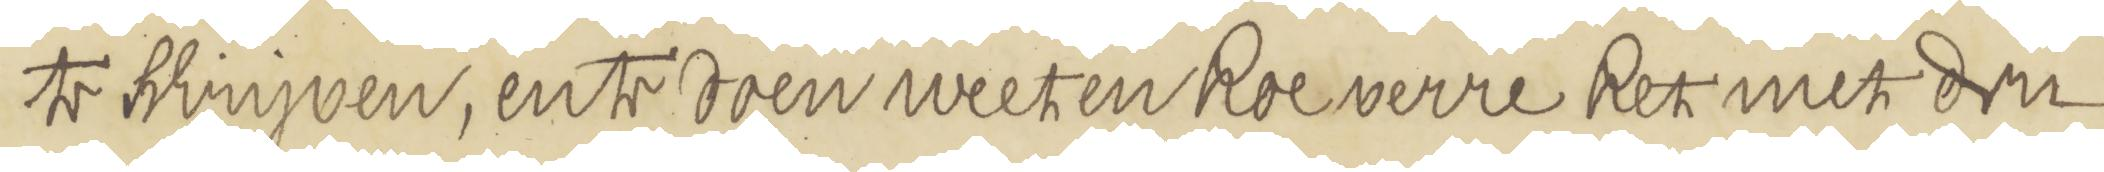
te schrijven, en te doen weeten hoe verre het met den
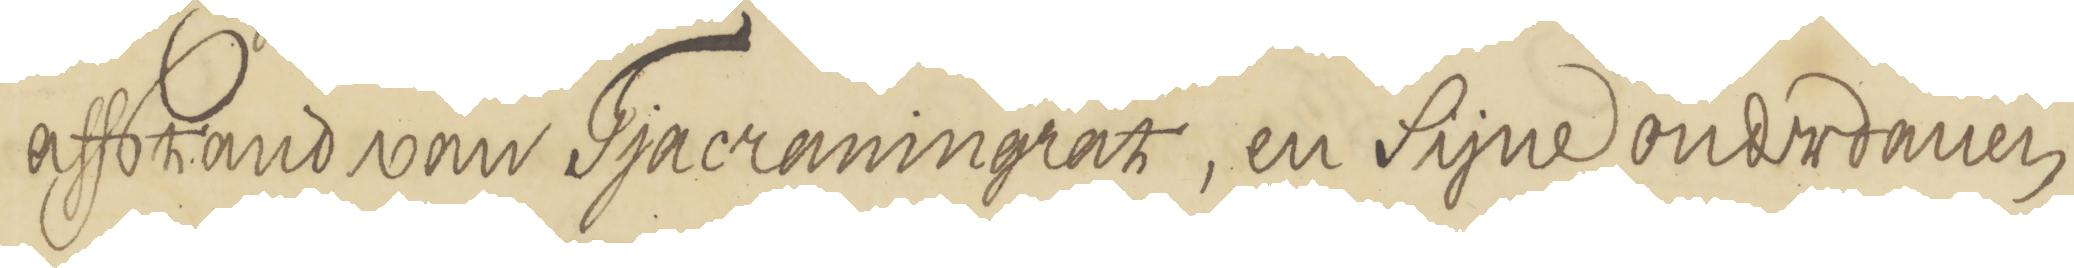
affstand van Tjacraningrat, en sijne onderdanen
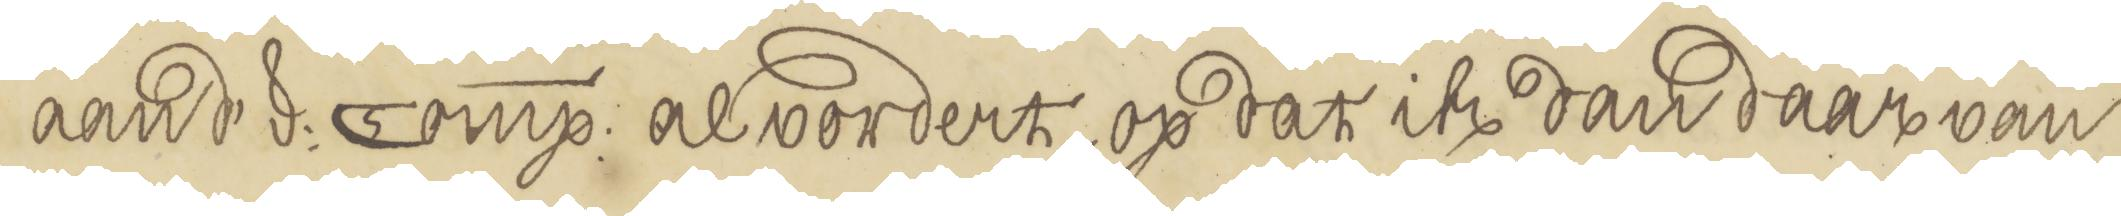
aan d’ E: comp: al vordert, op dat ik dan daar van
